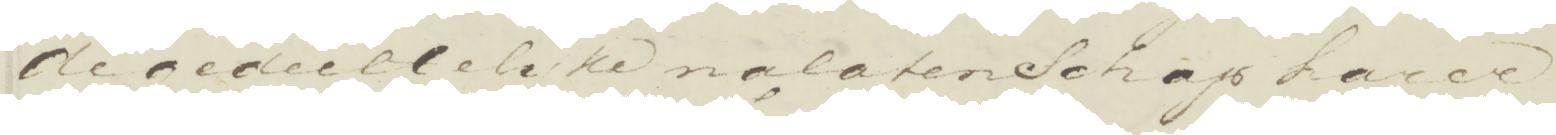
de gedeeltelyke nalatenschap harer
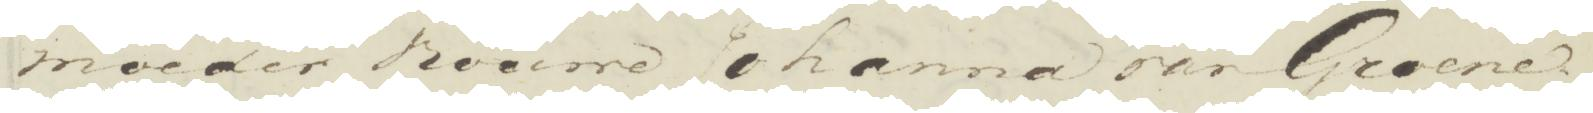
moeder Vrouwe Johanna van Groene
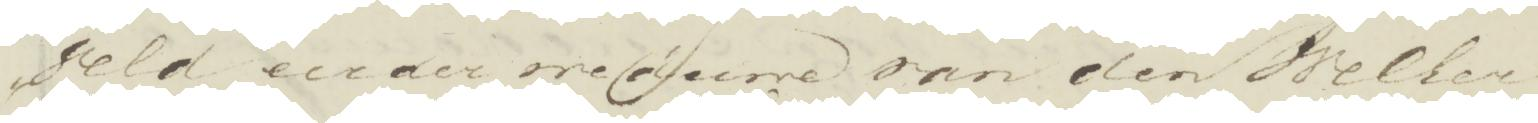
„veld eerder weduwe van den Wel Eer
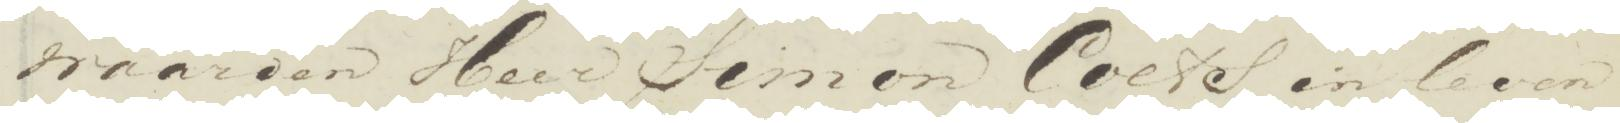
waarden Heer Simon Coets in leven
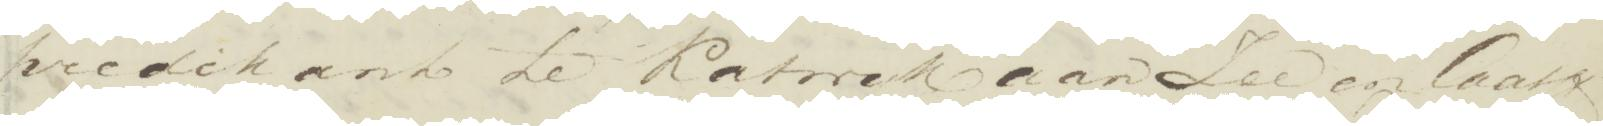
predikant te Katwyk aan Zee en laatst
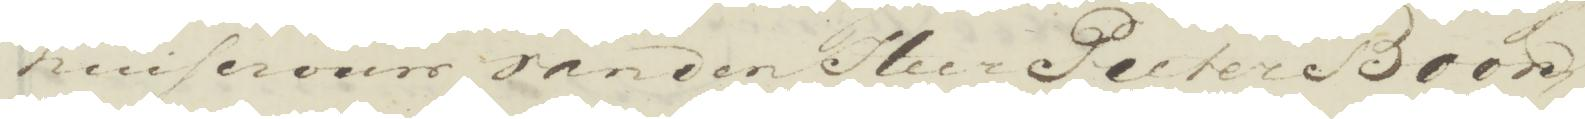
huisvrouw van den Heer Pieter Boon,
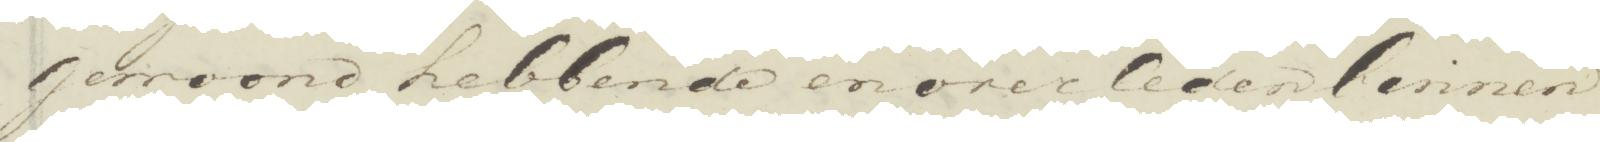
gewoond hebbende en overleden binnen
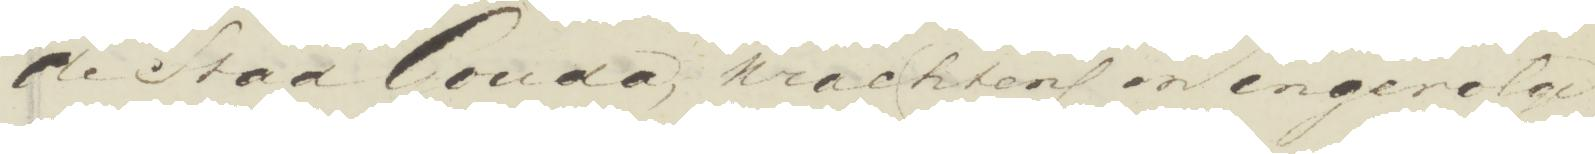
de stad Gouda, krachtens en ingevolge
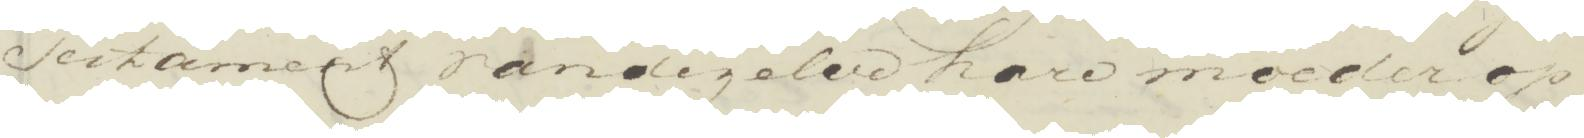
Testament van dezelve hare moeder op
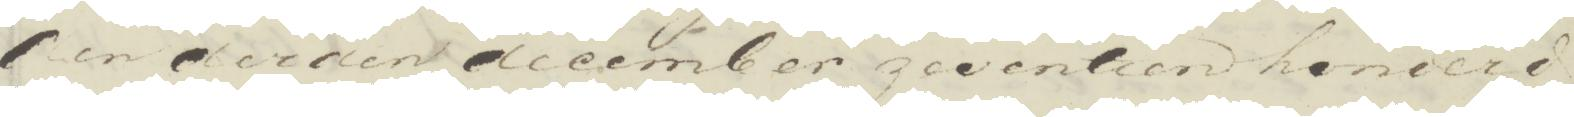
den derden december zeventien honderd
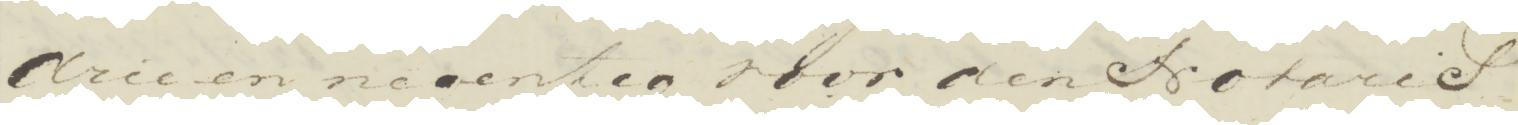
drie en negentig voor den Notaris
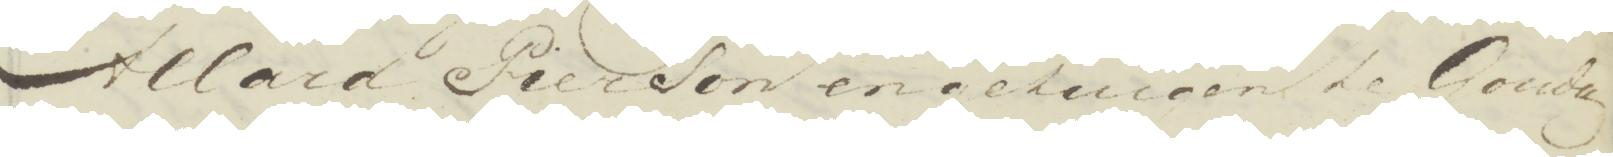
Allard Pierson en getuigen te Gouda
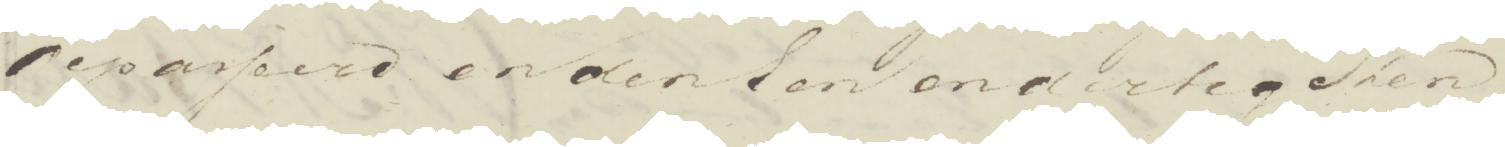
gepasseerd en den Een en dertigsten
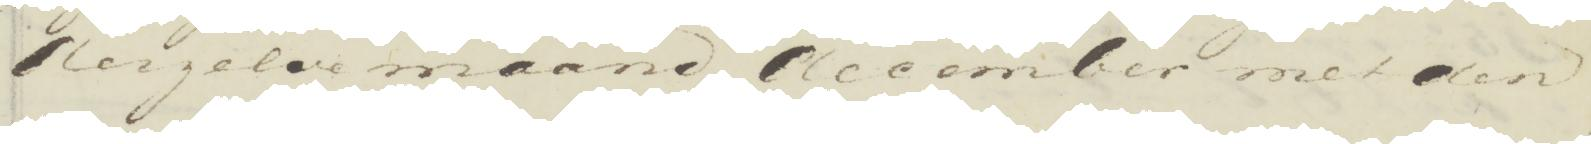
derzelve maand december met den
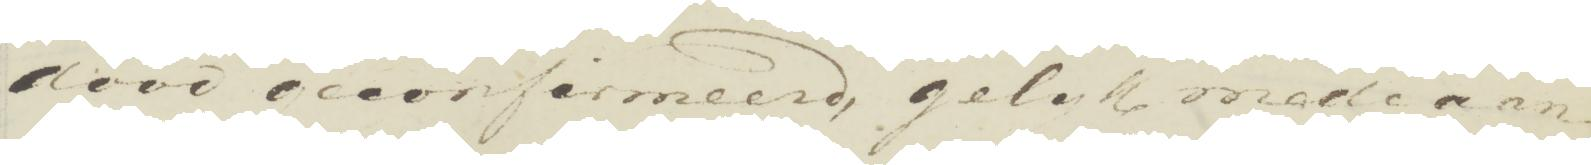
dood geconfirmeerd, gelyk mede aan
